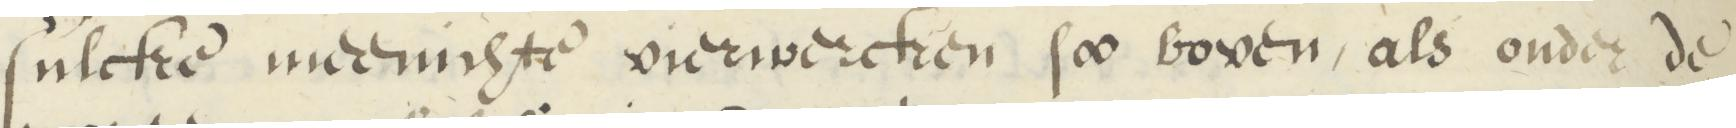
sulcke meenichte vierwercken soo boven, als onder de
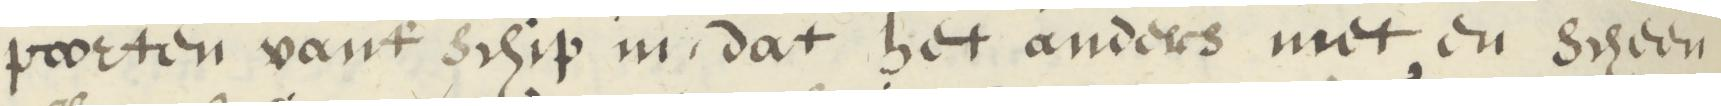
poorten vant schip in, dat het anders niet en scheen
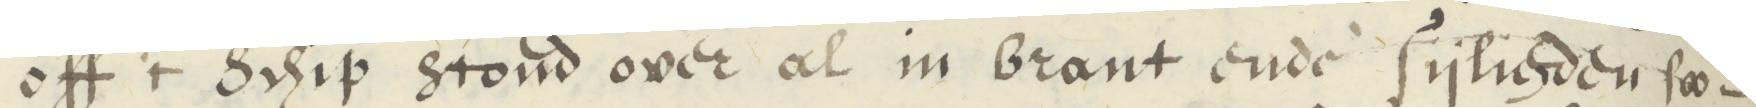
off ’t schip stond over al in brant ende sijlieden soo
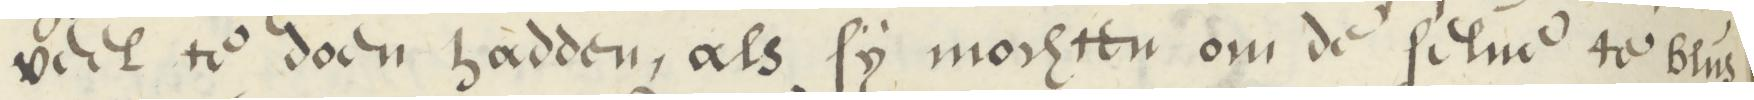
veel te doen hadden, als sij mochten om de selve te blus
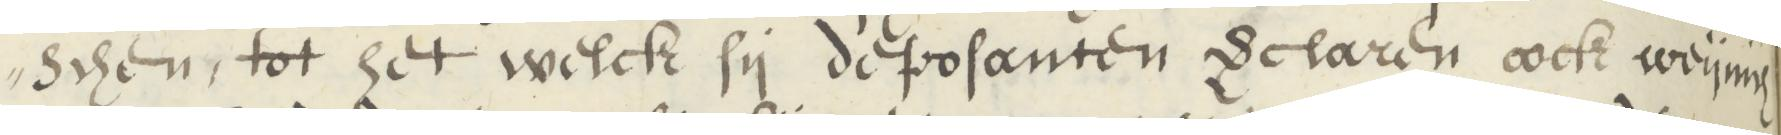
„schen, tot het welck sij deposanten verclaren ock weijnich
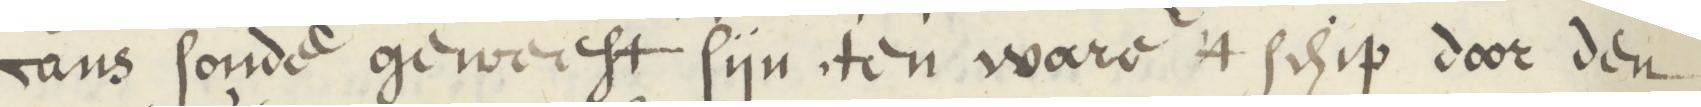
cans soude geweest sijn, ten ware ’t schip door den
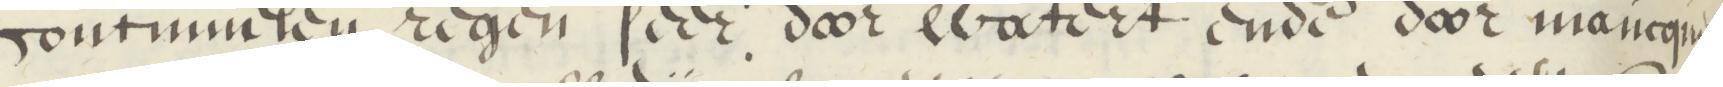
continuelen regen seer door watert ende door mancque
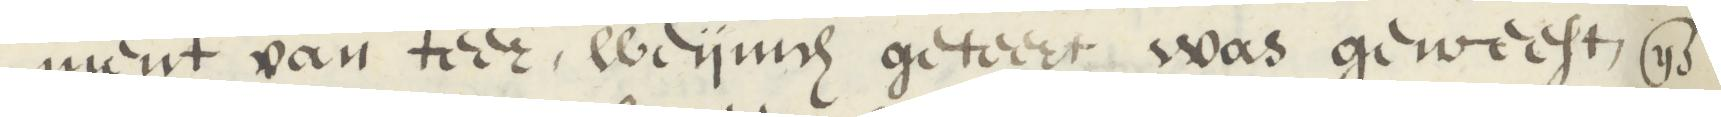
ment van teer, weijnich geteert was geweest, ende
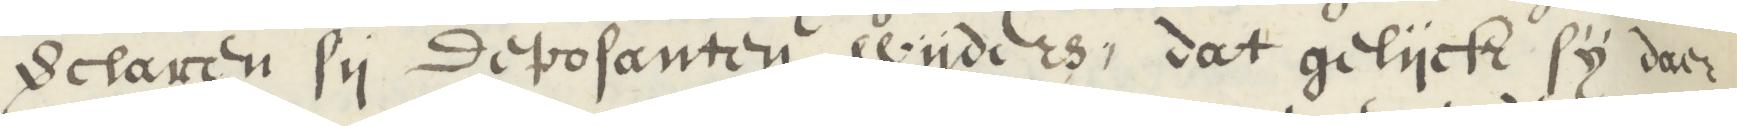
verclaren sij deposanten wijders; dat gelijck sij daer
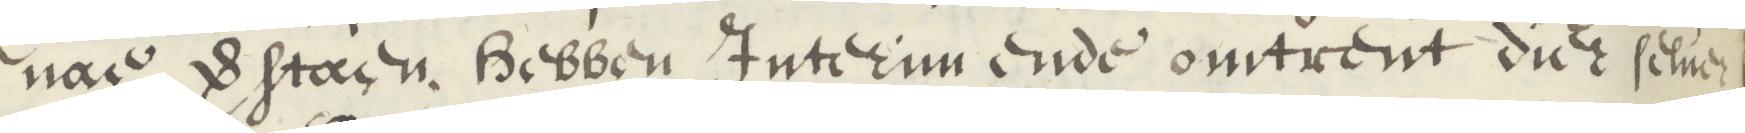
nae verstaen hebben Interim ende omtrent dier scheur
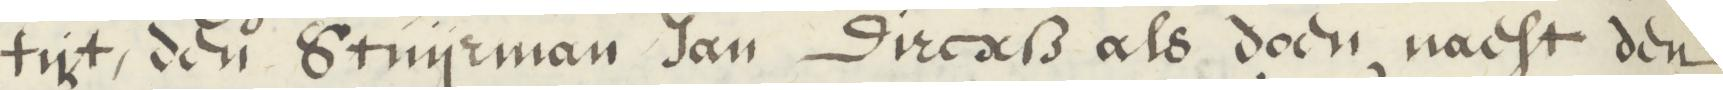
tijt, den stuijrman Jan Dircx als doen naest den
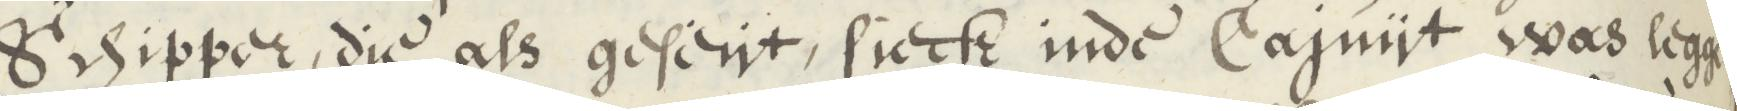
schipper, dis als geseijt, sieck inde Cajuijt was leggen
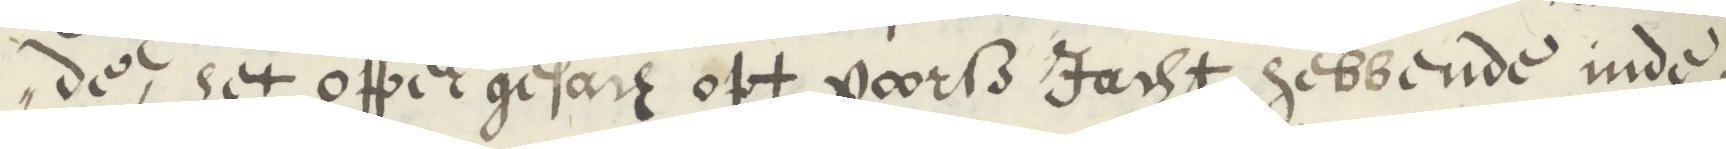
„de, het oppergesach opt voorsz Iacht hebbende inde
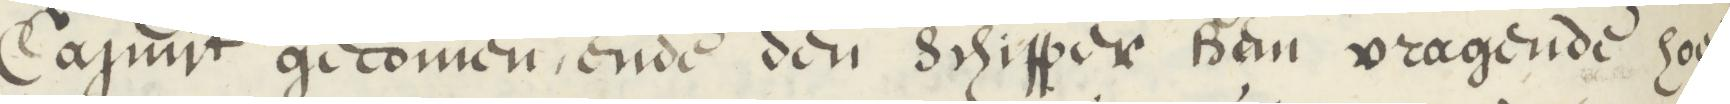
Cajuijt gecomen, ende den schipper hem vragende hoe
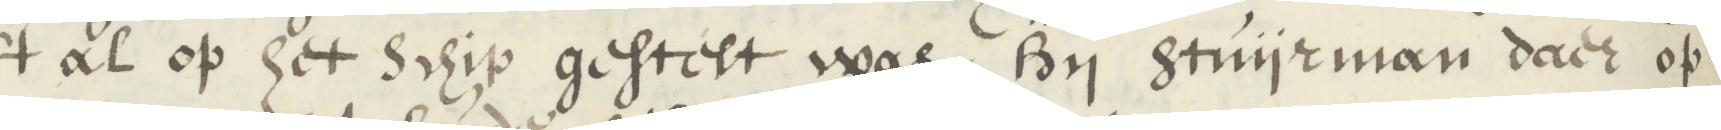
’t al op het schip gestelt was, hij stuijrman daer op
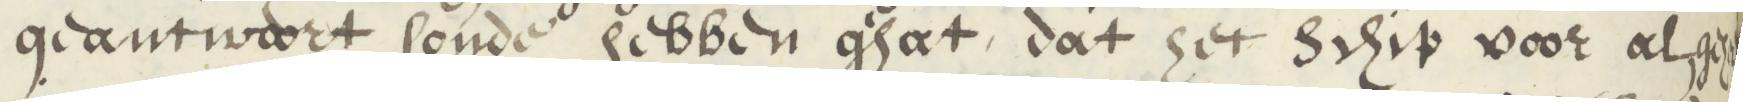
geantwoort soude hebben gehat, dat het schip voor al, geh
